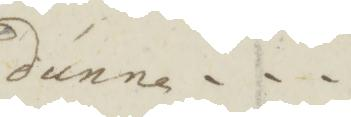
dunne
